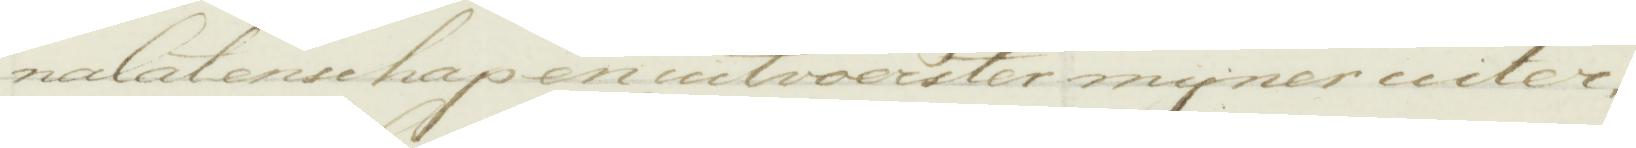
nalatenschap en uitvoerster mijner uiter„
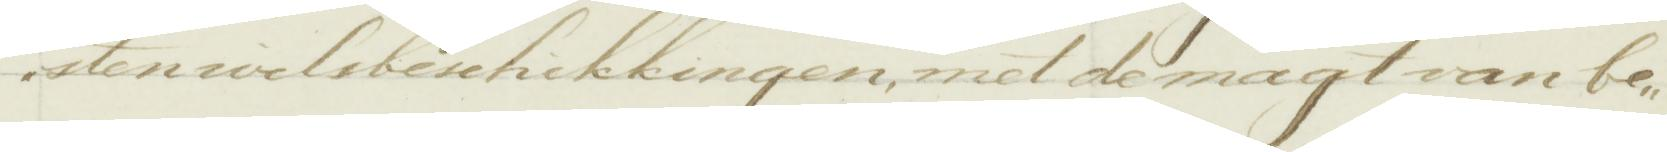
„sten wilsbeschikkingen, met de magt van be„
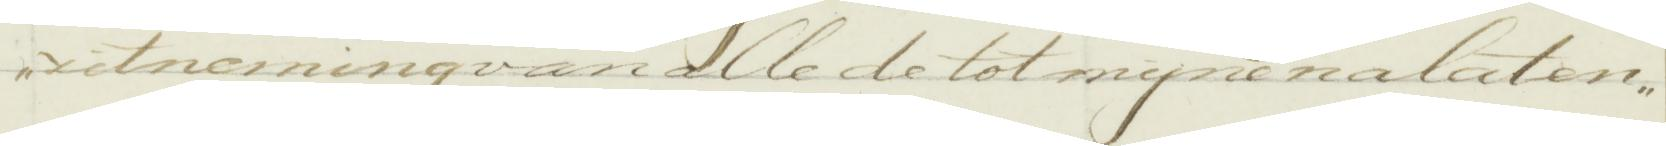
„zitneming van alle de tot myne nalaten„
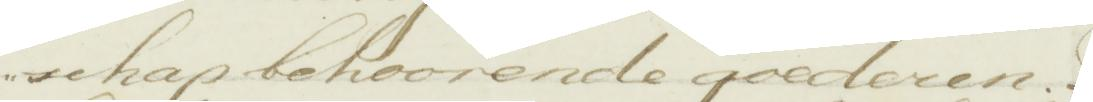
„schap behoorende goederen.-
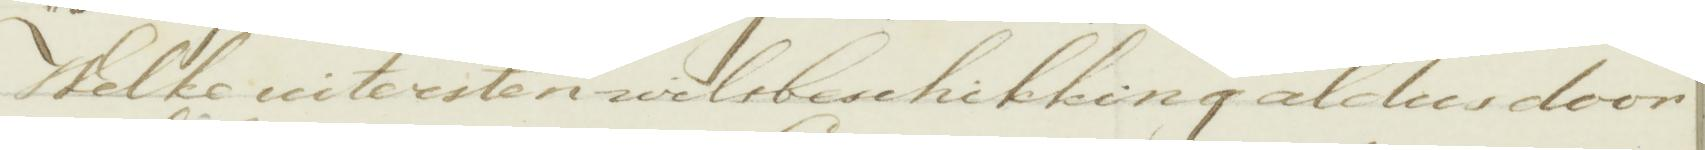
Welke uitersten wilsbeschikking aldus door
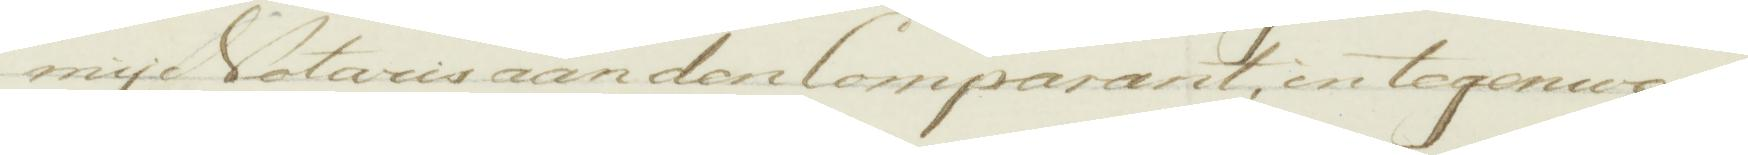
mij Notaris aan den Comparant, in tegenwoor
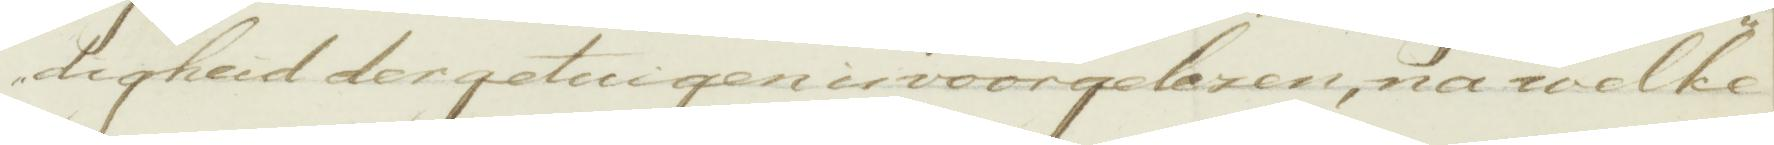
„digheid der getuigen is voorgelezen, na welke
